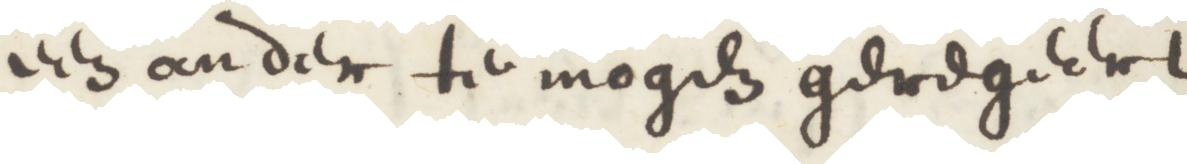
een ander te mogen geregeert
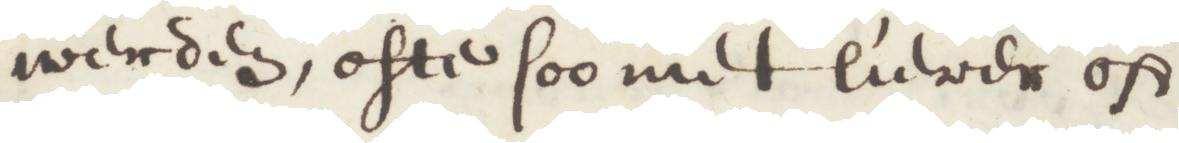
werden, ofte soo niet liever op
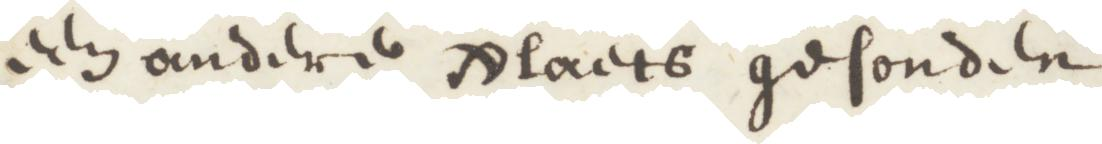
een andere plaets gesonden
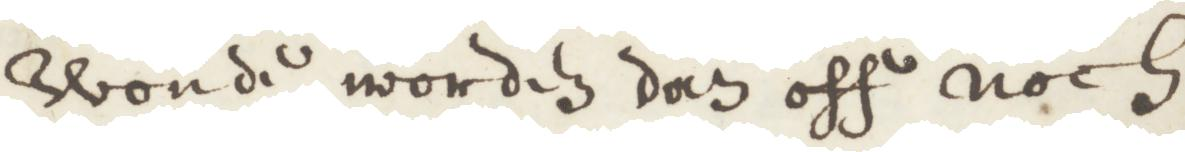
woude worden dan off noch
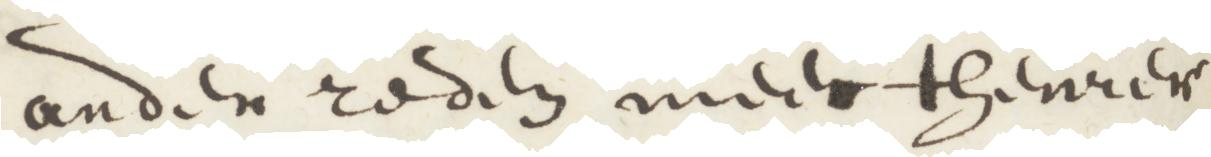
ander reden meer theurer
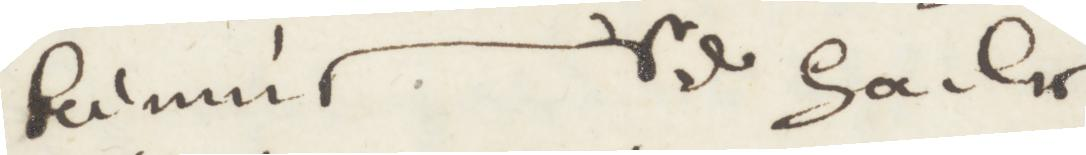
kennisse haer
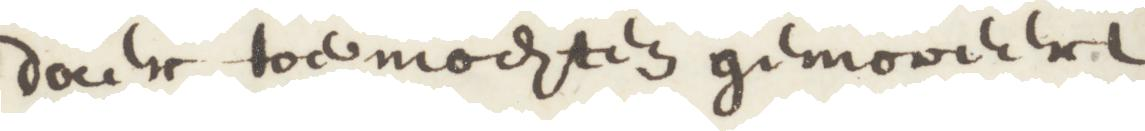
daer toe mochten gemoveert
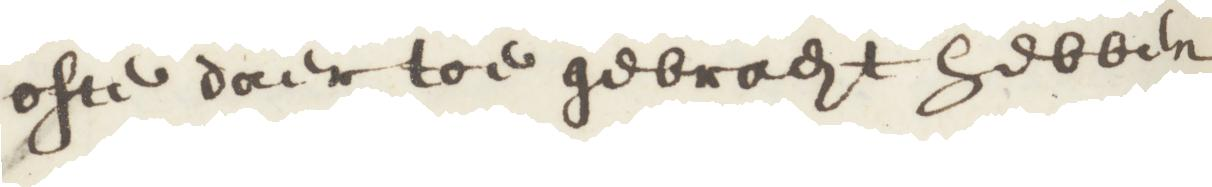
ofte daer toe gebracht hebben
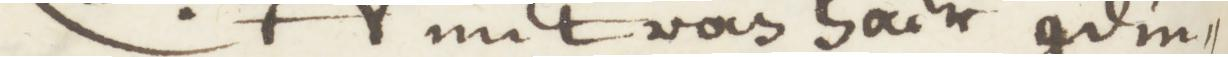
Off niet van haer gein„
